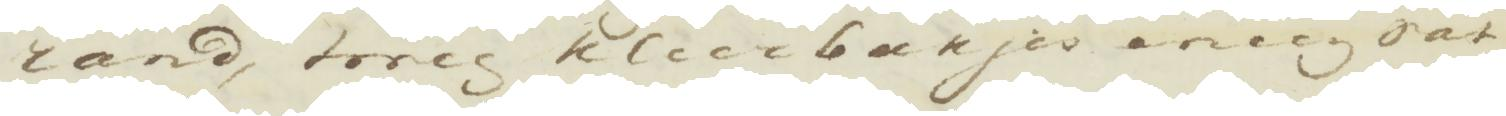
rand, tweekleer bakjes en een vat
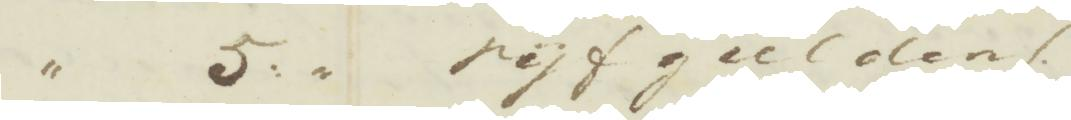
„ 5: „ vijf guldens.
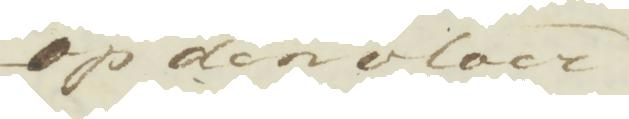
op den vloer
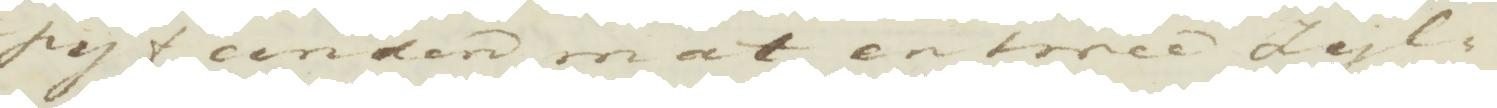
vyf einden mat en twee zijl„
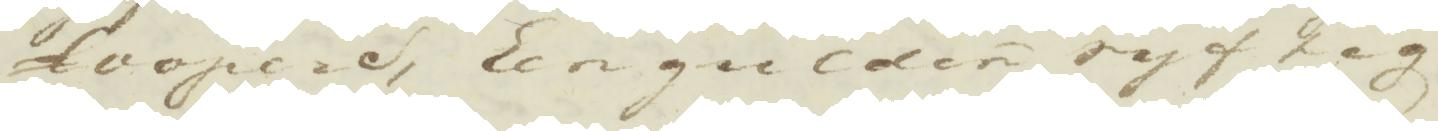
loopers, Een gulden vyftig
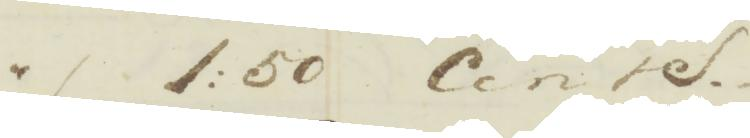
„ 1:50 Cents.
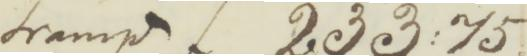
Transp ƒ 233:75
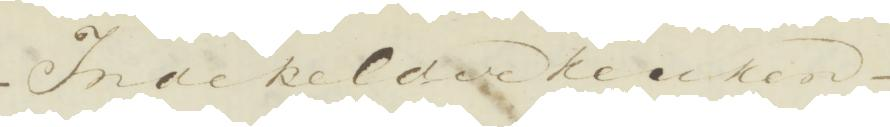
In de kelder keuken
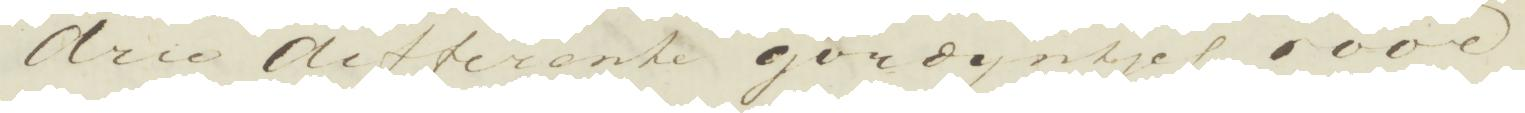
drie differente gordijntjes voor
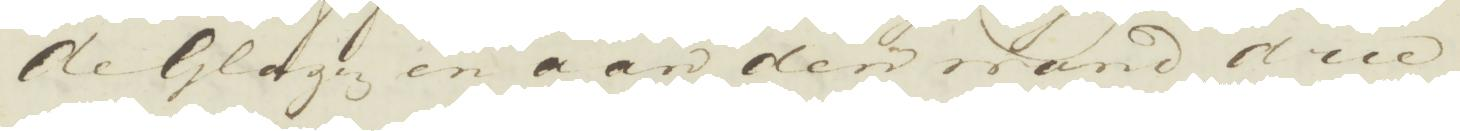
de Glazen en aan den wand drie
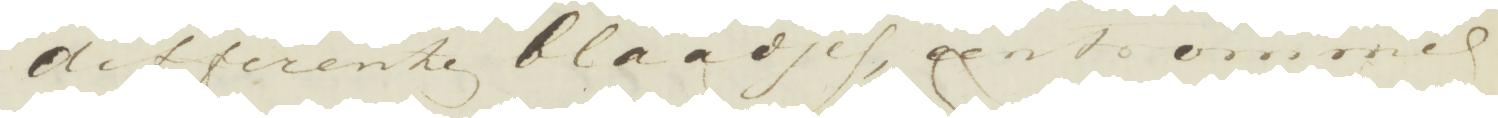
differente blaadjes, een trommel
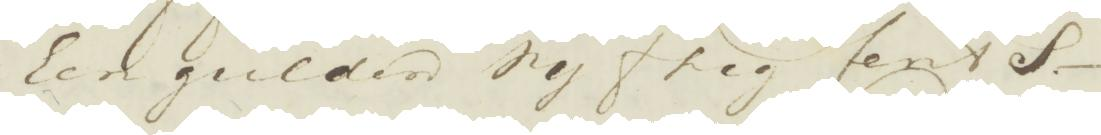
Een gulden vijftig Cents
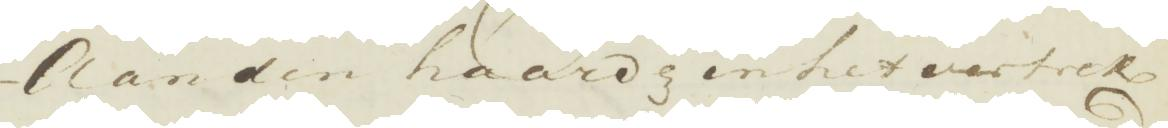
Aan den haard en in het vertrek
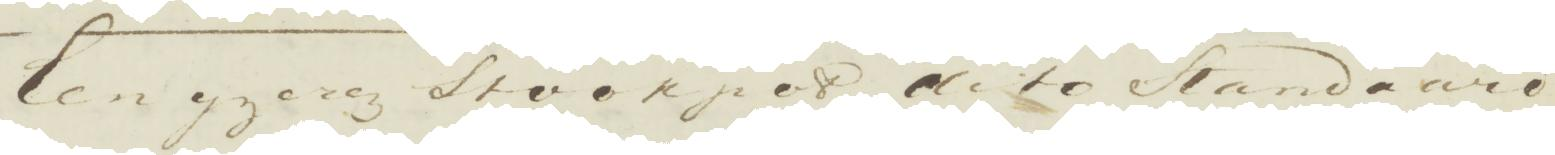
Een yzeren stookpot dito standaard
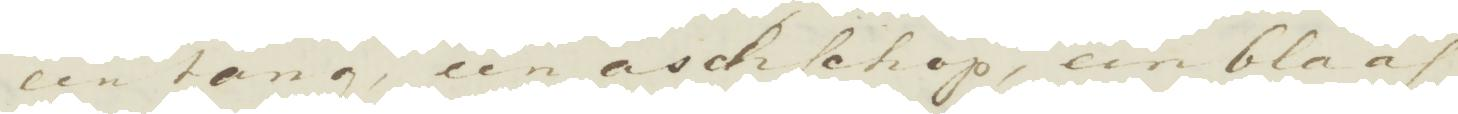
een tang, een asch schop, een blaas
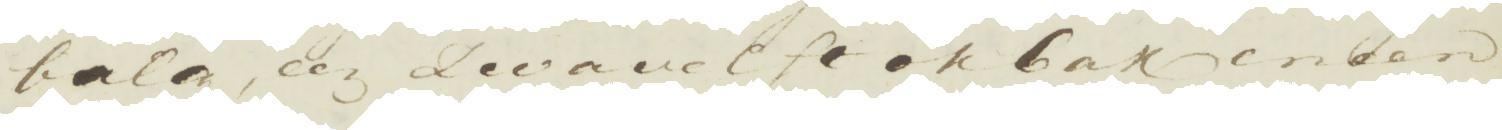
balg, een zwavelstok bak en een
